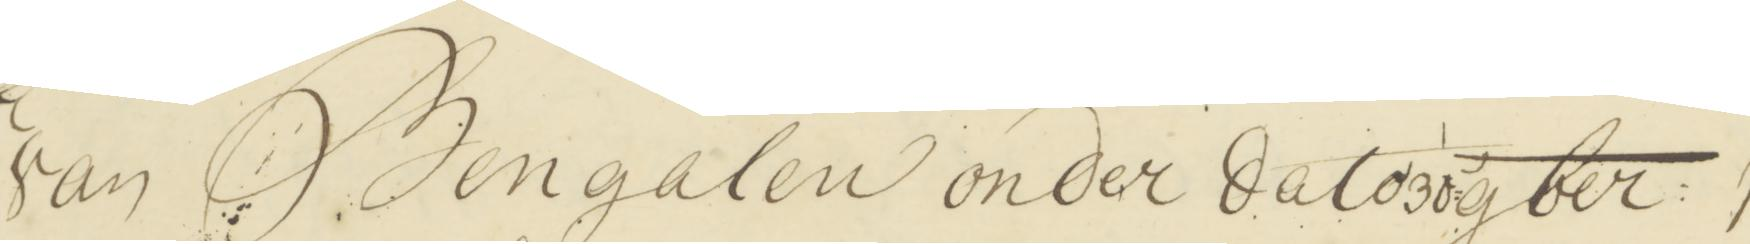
Van Bengalen onder dato 30: 9ber: 1730
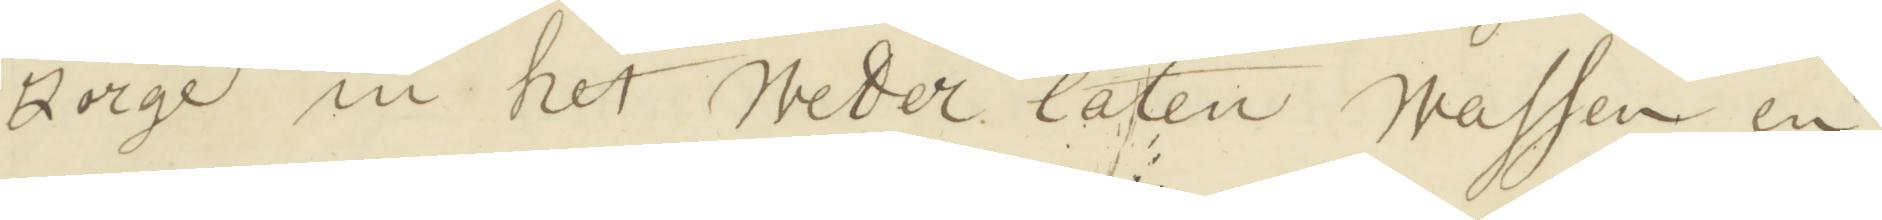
zorge in het weder laten wassen en
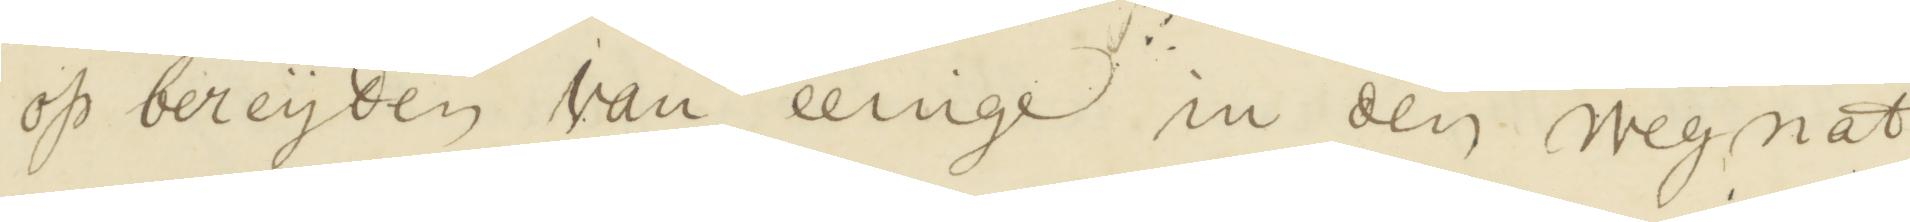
op bereijden van eenige in den weg nat
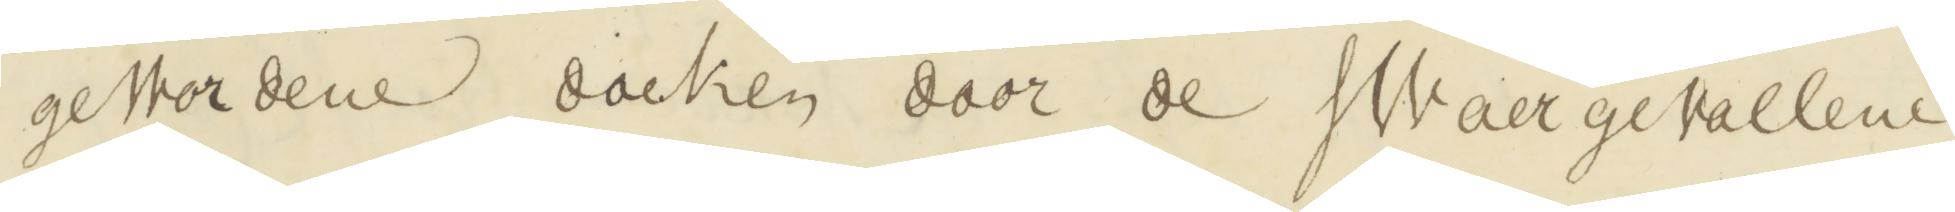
gewordene doeken door de Swaer gevallene
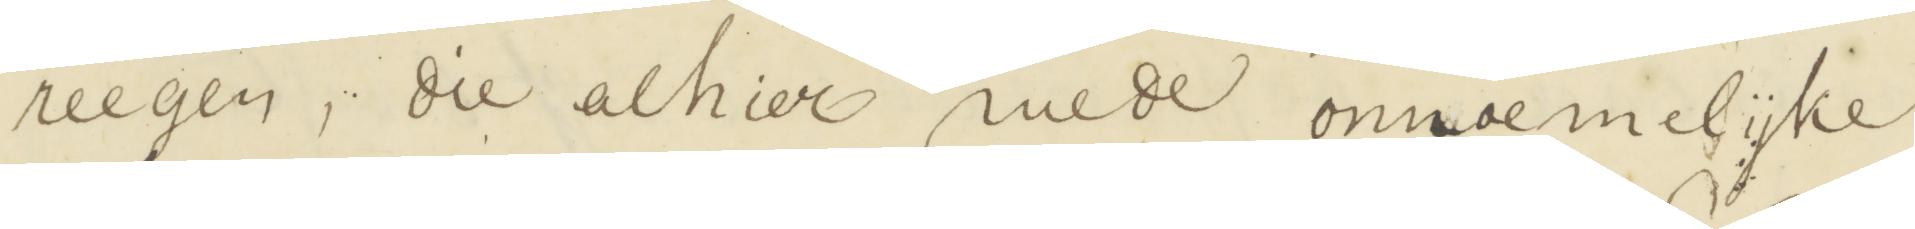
reegen, die alhier mede onnoemelijke
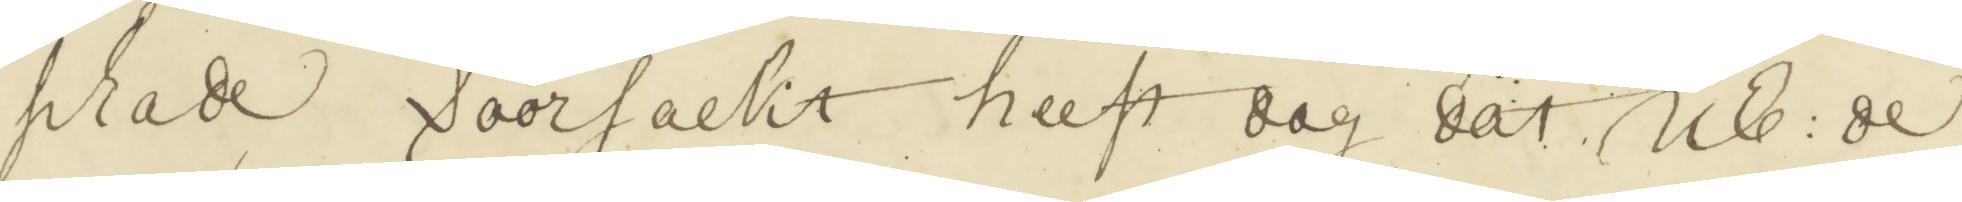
schade veroorsaekt heeft dog dat UE: de
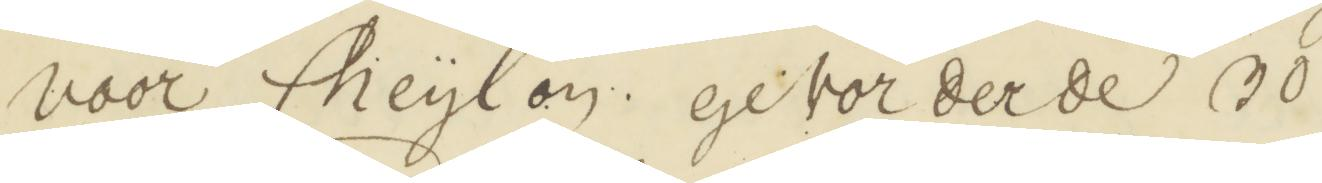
voor Cheijlon: gevorderde 30
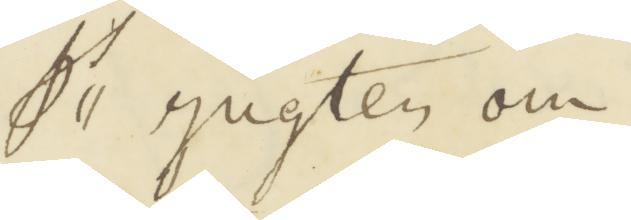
p:s jugten om
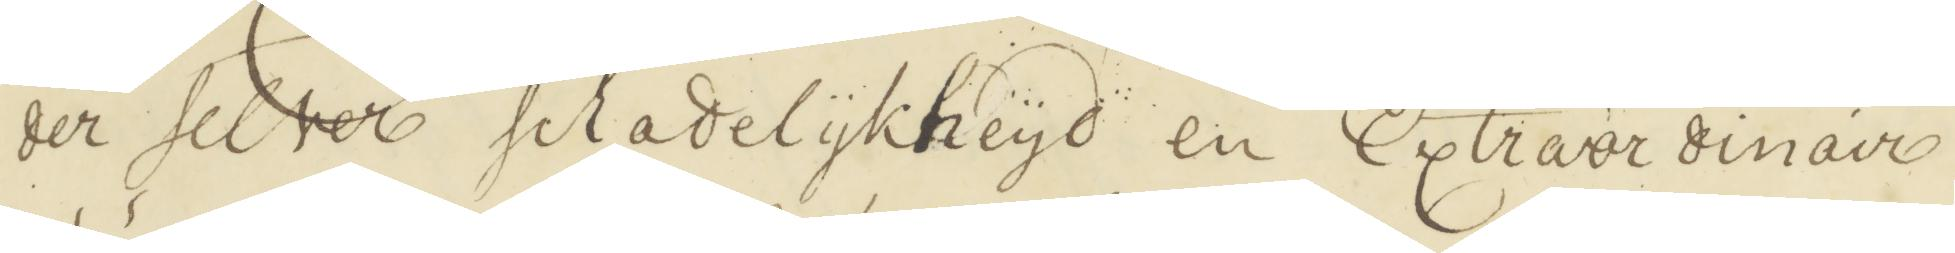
der selver schadelijkheijd en Extraordinair
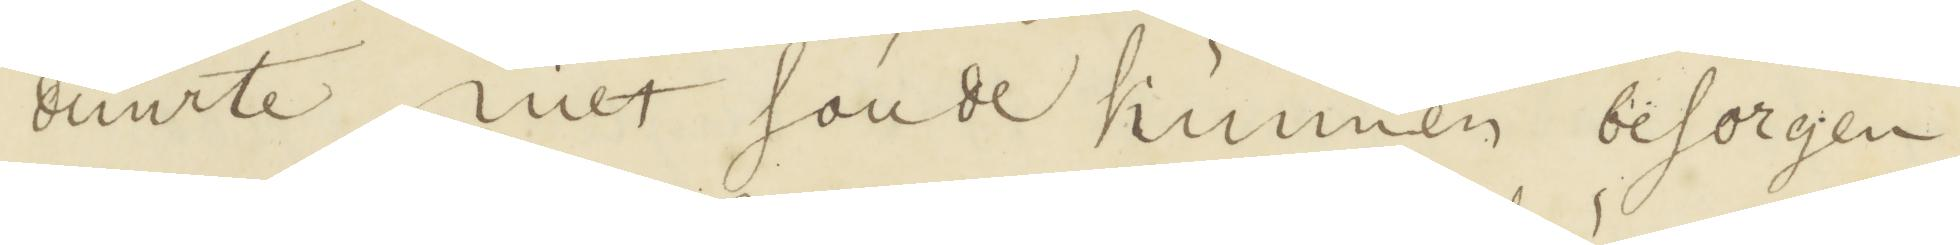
duurte niet Soude kunnen besorgen
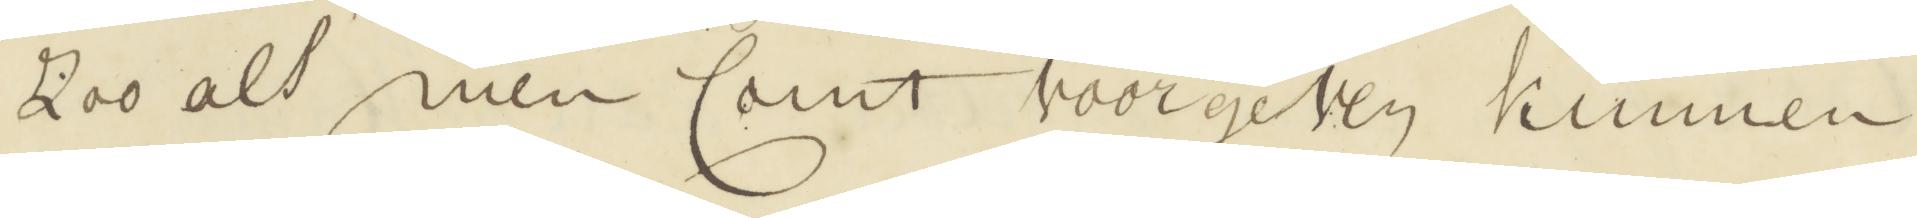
Zoo als men Comt voor geven kunnen
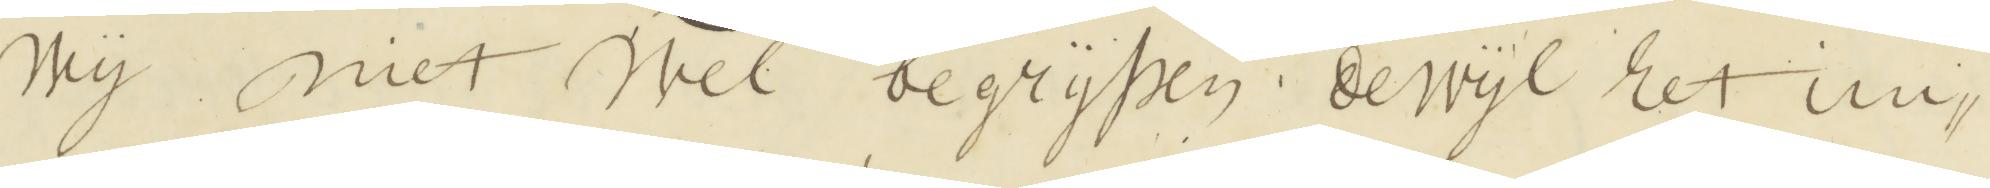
Wij niet Wel begrijpen dewijl het im„
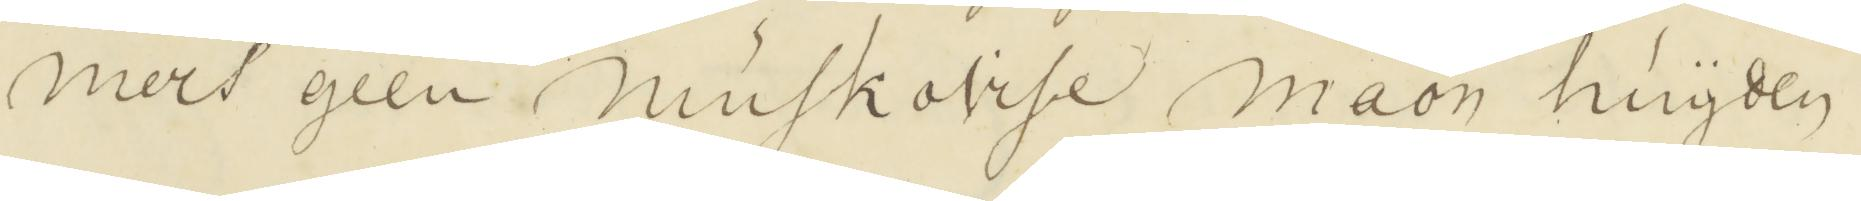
mers geen muskokse maon huijden
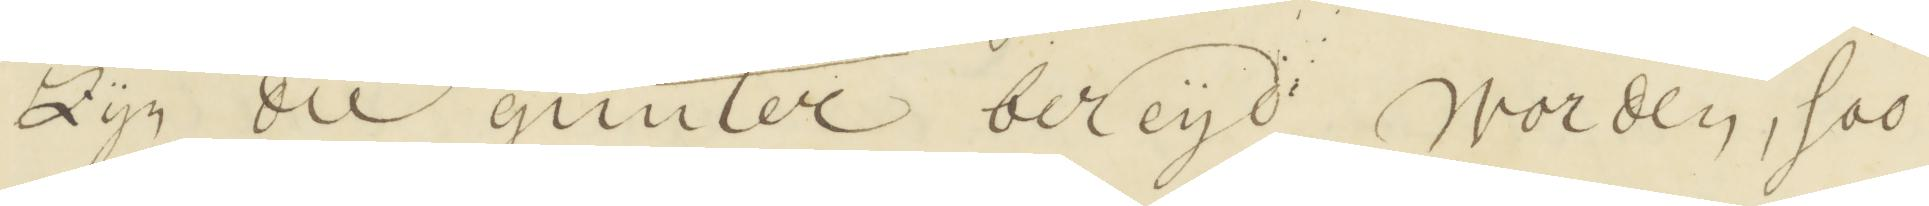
Zijn die gunter beheijd Worden, Soo
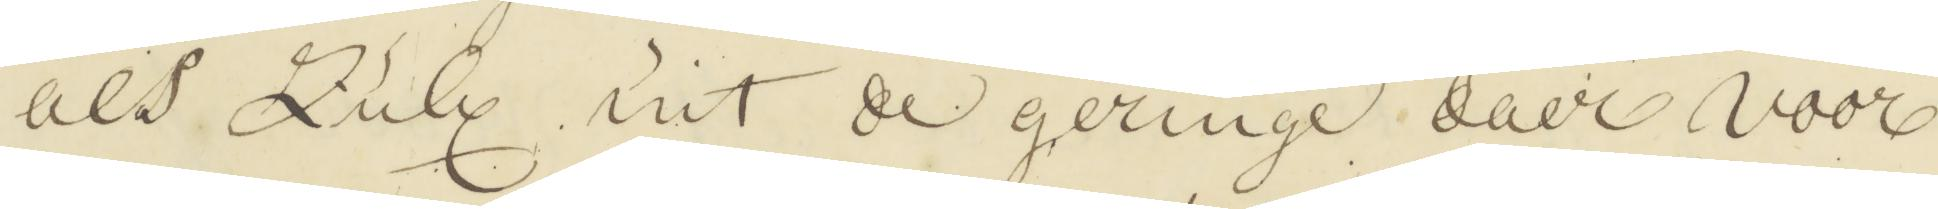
als Zulx uit de geringe daer voor
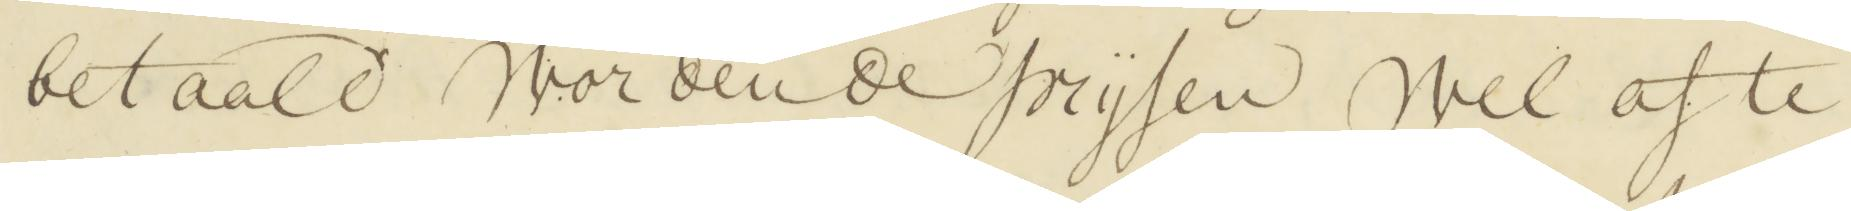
betaald Wordende prijsen Wel afte
